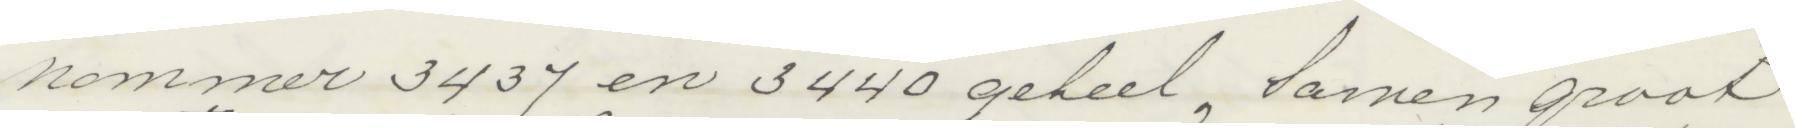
nommer 3437 en 3440 geheel, samen groot
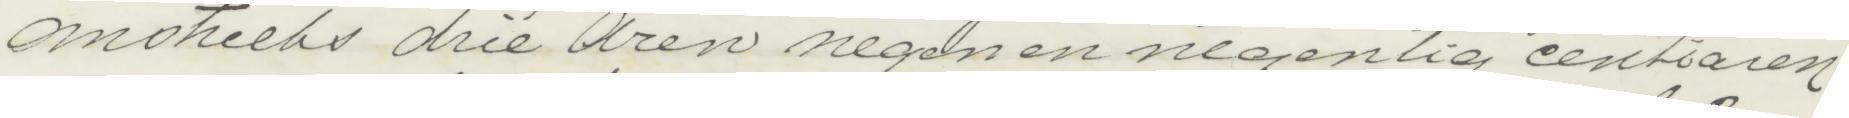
omstreeks drie Aren negen en negentig centiaren
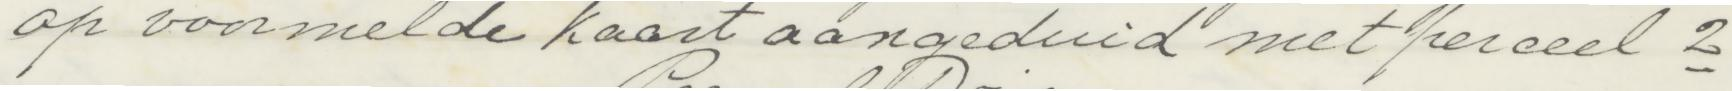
op voormelde kaart aangeduid met perceel 2
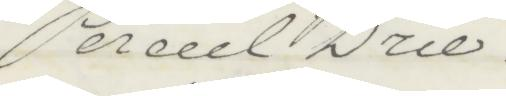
Perceel Drie
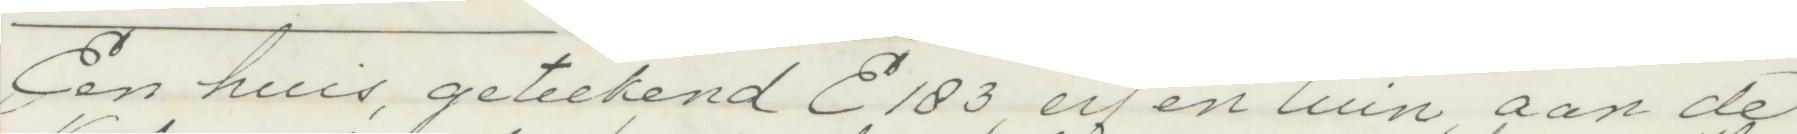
Een huis, geteekend E 183, erf en tuin, aan de
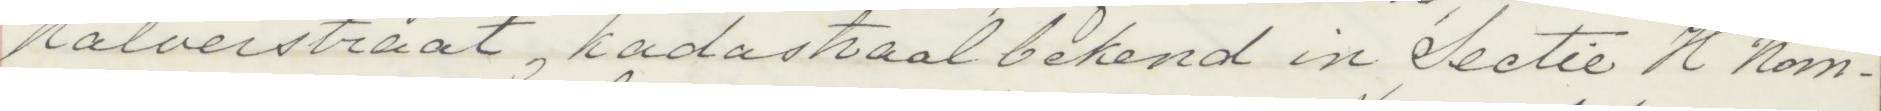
Kalverstraat, kadastraal bekend in sectie H nom-
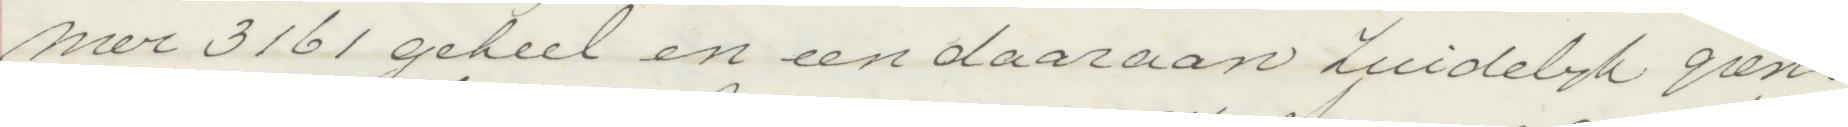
mer 3161 geheel en een daaraan zuidelyk gren-
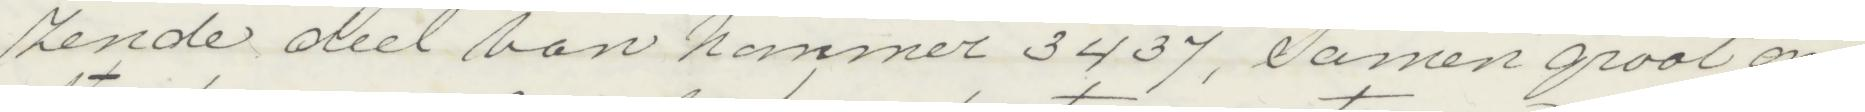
zende deel van nommer 3437, samen groot om-
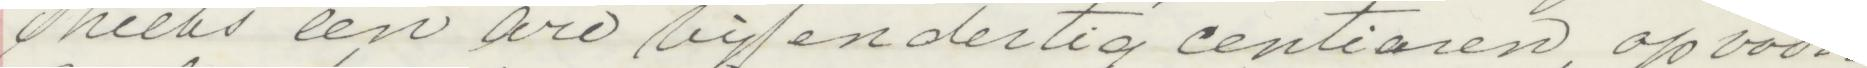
streeks een are vijf en dertig centiaren, op voor-
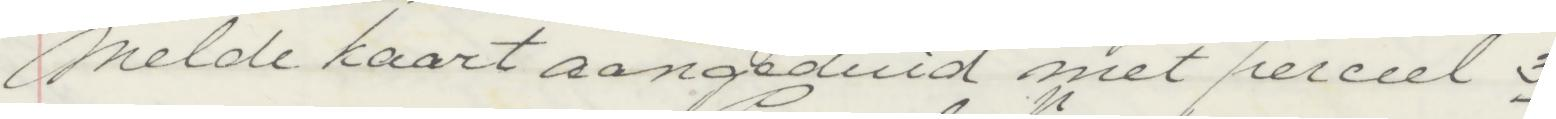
melde kaart aangeduid met perceel 3
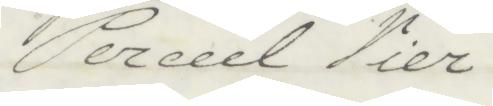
Perceel Vier
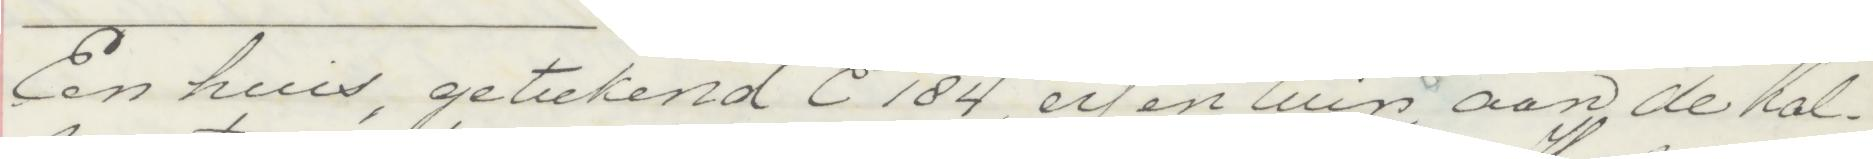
Een huis, getekend E 184, erf en tuin, aan de Kal-
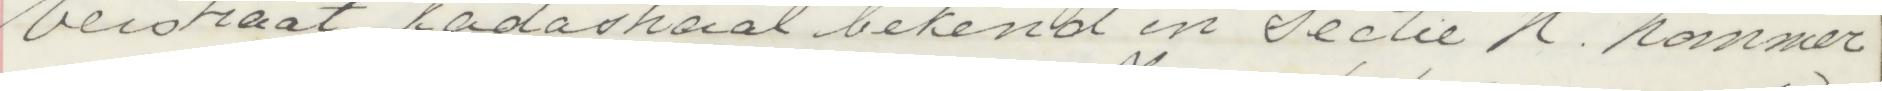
verstraat, kadastraal bekend in sectie H. nommer
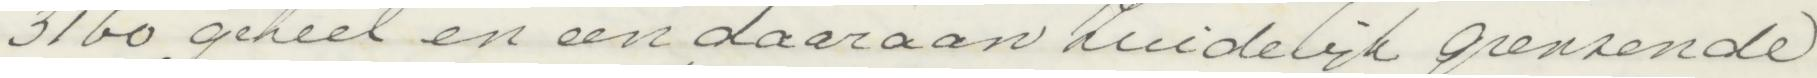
3160 geheel en een daaraan Zuidelijk grenzende
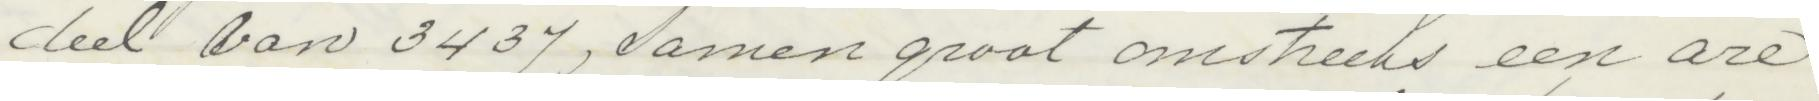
deel van 3437, samen groot omstreeks een are
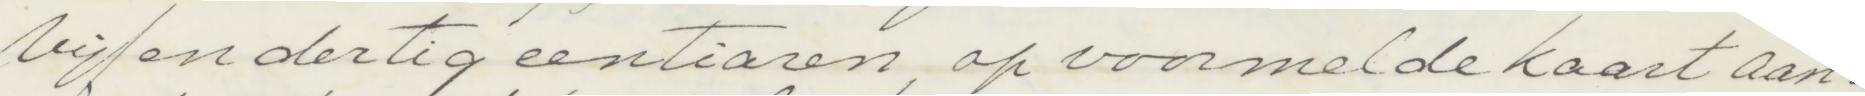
vijf en dertig centiaren, op voormelde kaart aan-
